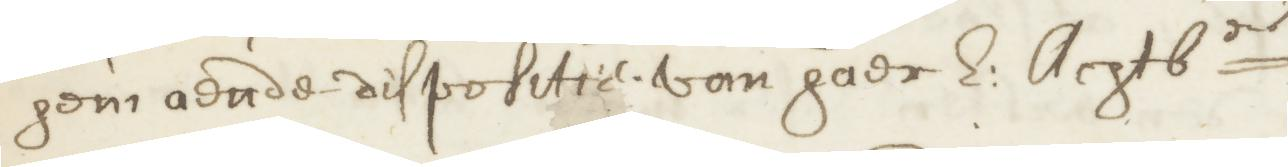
hem aende dispositie van her E: Achtb=ens
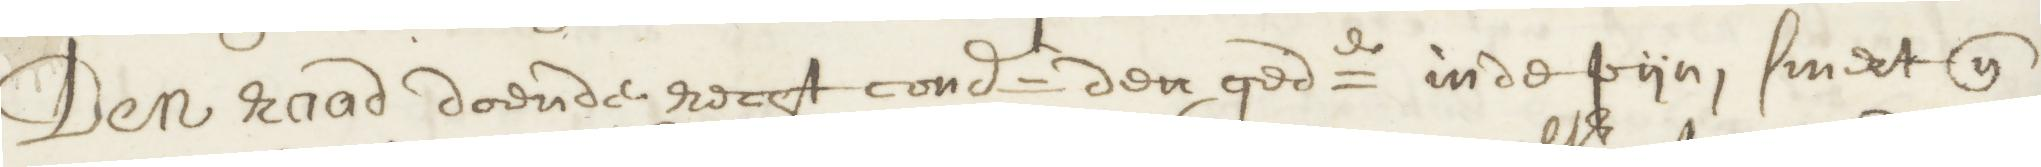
Den raad doende recht cond=t den ged=e inde pijn, smert ende
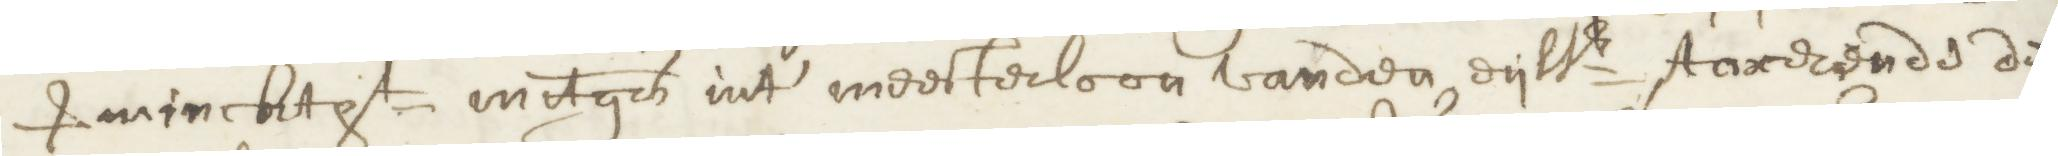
verminckth=t mitgrs int' meesterloon vanden eijss=r taxerende de
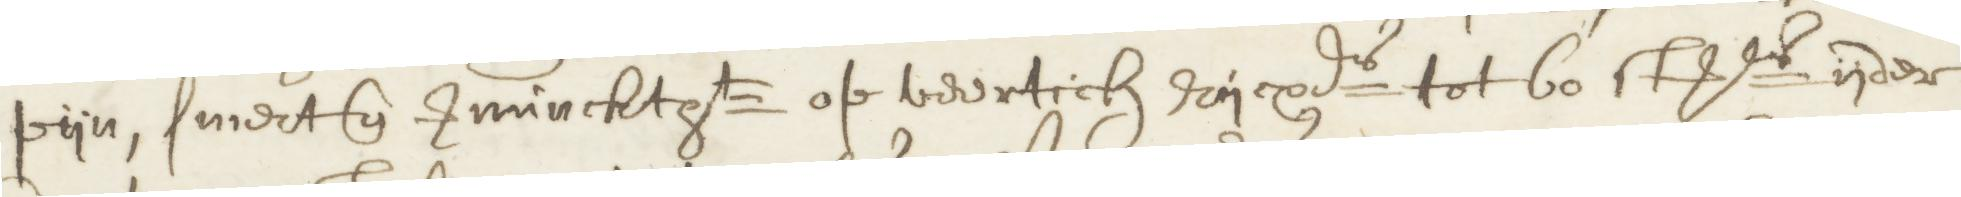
pijn, smert ende verminckth=t op veertich rijcxd=rs tot 60 st=rs ijder
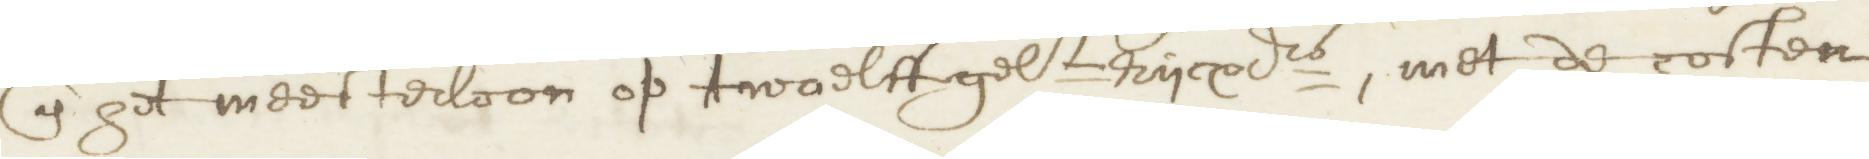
ende het meesterloon op twaelff gelijk rijcxd=rs, met de costen
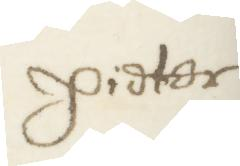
Pieter
